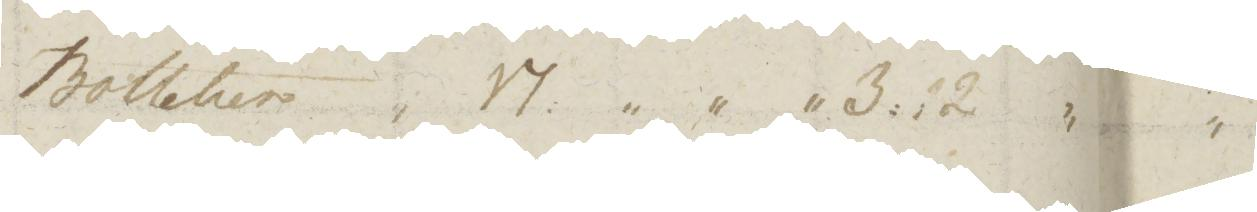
Bottelier „ 17: „ „ „ 3:12 „ „
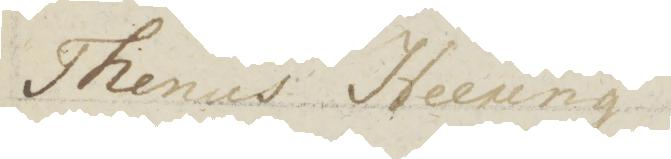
Thenus Heering
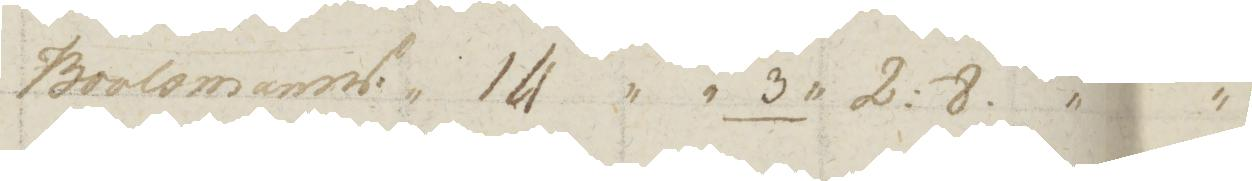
Bootsmansm:t „ 14 „ „ 3 „ 2: 8. „ „
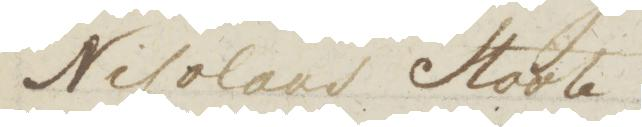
Nicolaas Stoote
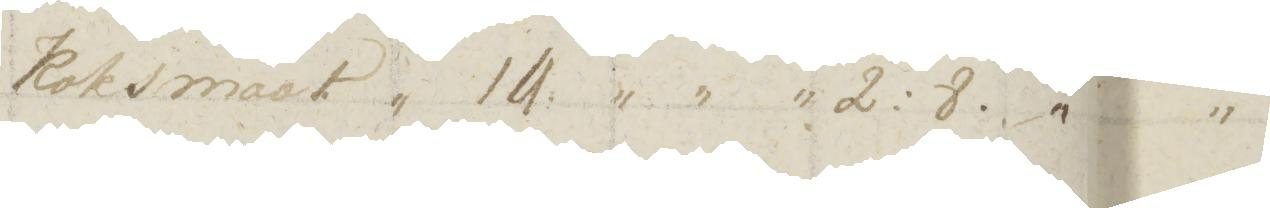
Koksmaat „ 14: „ „ „ 2: 8. „ „
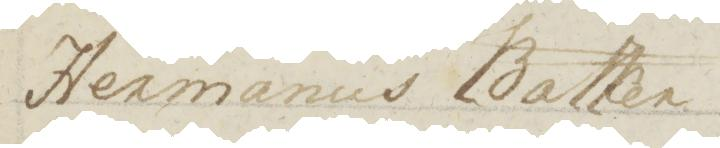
Hermanus Batter
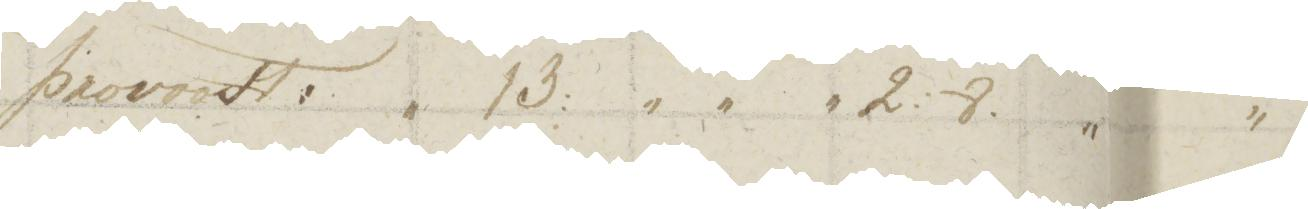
Provoost: „ 13: „ „ „ 2: 8. „ „
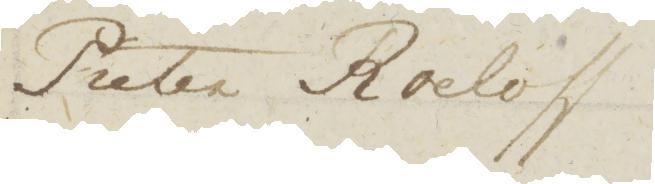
Pieter Roeloff
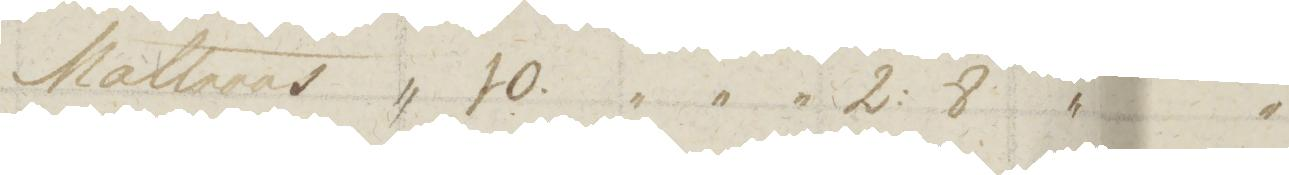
Mattroos „ 10. „ „ „ 2: 8 „ „
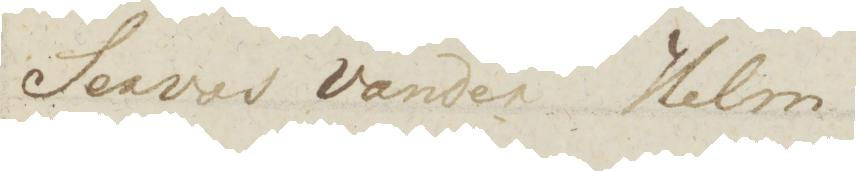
Servas vander Helm
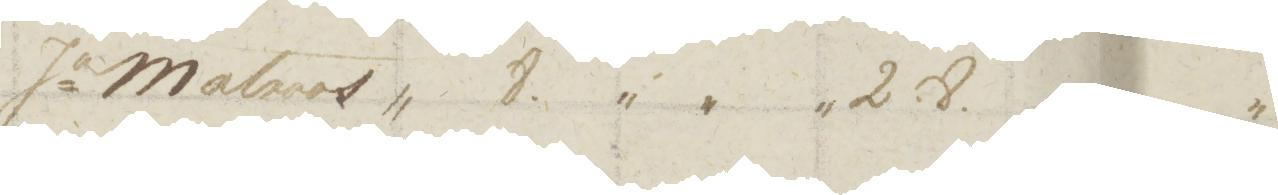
J=a Matroos „ 8. „ „ „ 2 .8. „
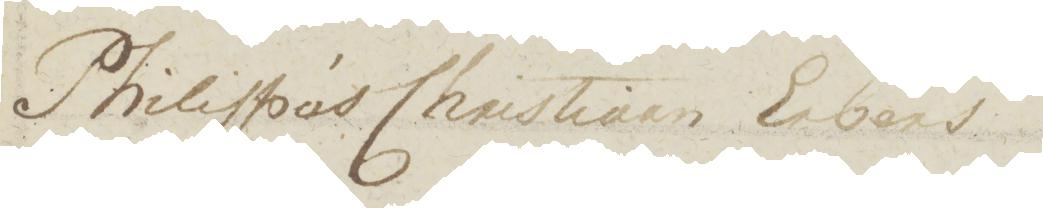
Philippus Christiaan Erbers
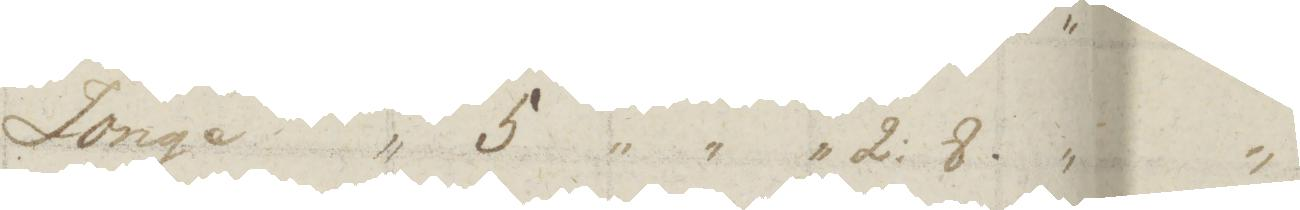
Jonge „ 5 „ „ „ 2: 8. „ „
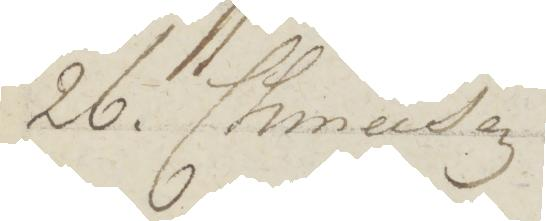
26: Chineesen
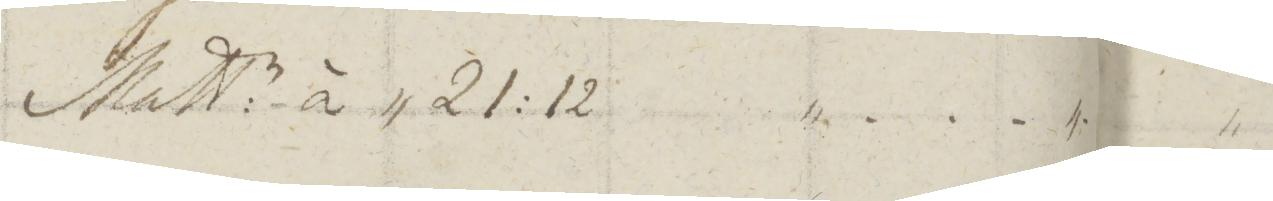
Matr:n à „ 21:12 „ . . - „
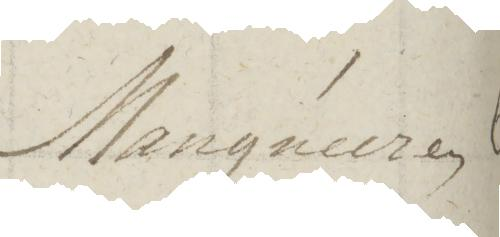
Manqueeren
